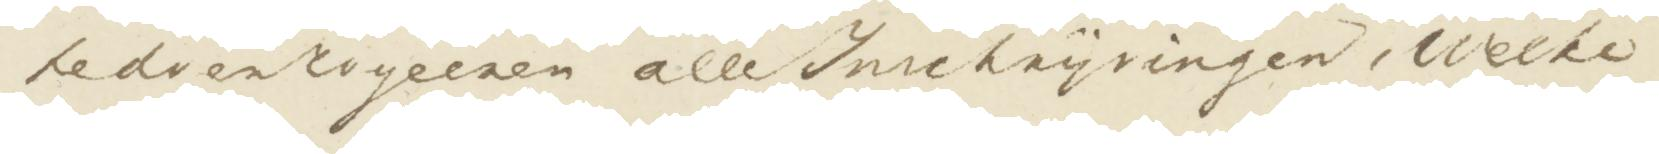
te doen royeeren alle Jnschrijvingen, welke
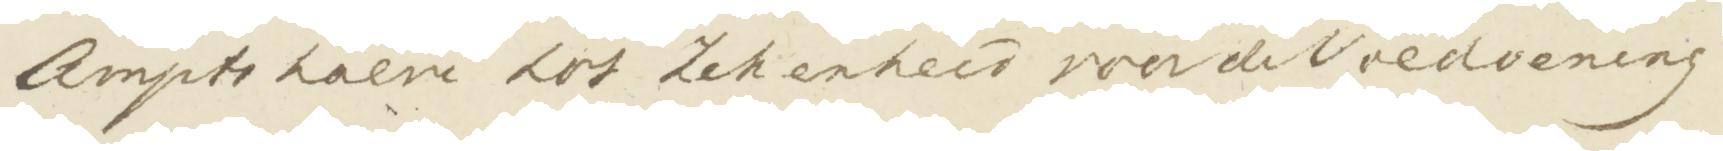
Amptshalve tot zekenheid voor de voldoening
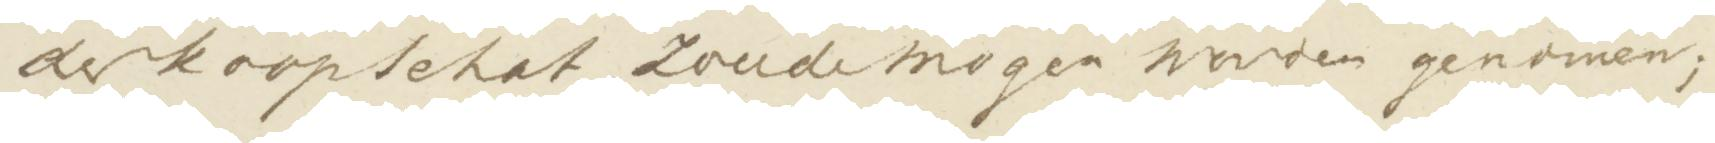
der koopschat, zoude mogen worden genomen;
